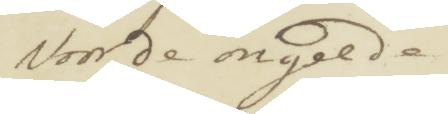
voor de ongelde
